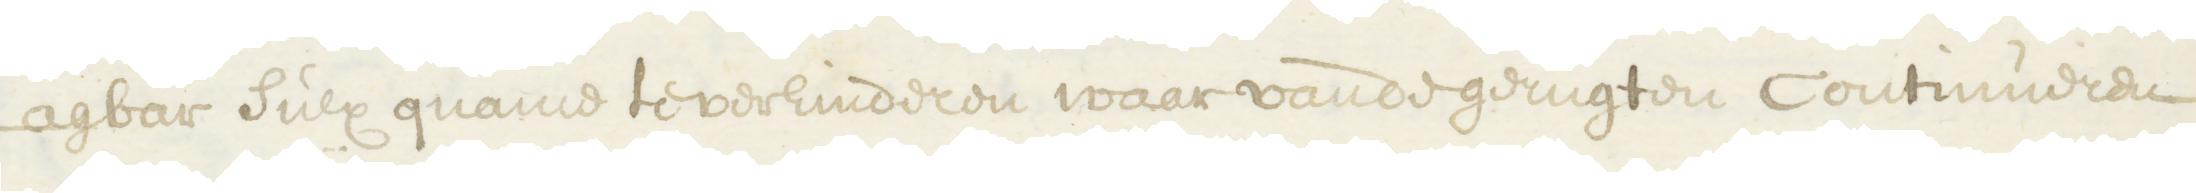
agbar sulx quame te verhinderen waar van de gerugten continueren
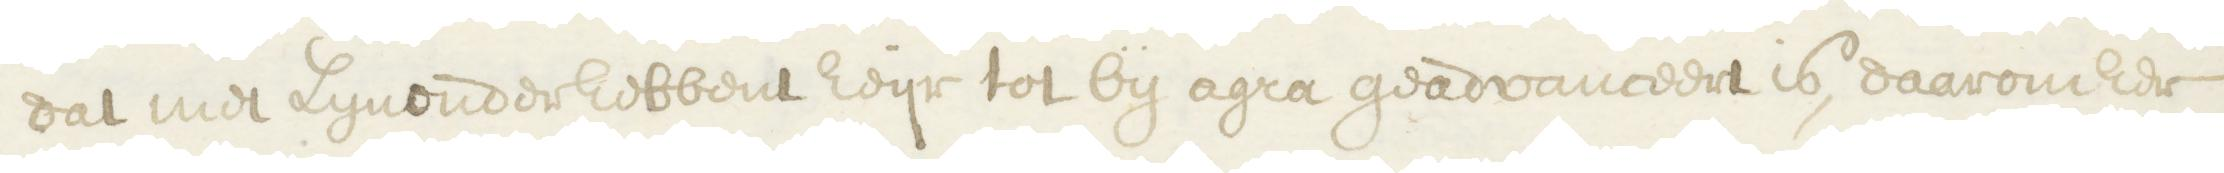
dat met zyn onderhebbent heijr tot bij agra geadvanceert is, daarom her
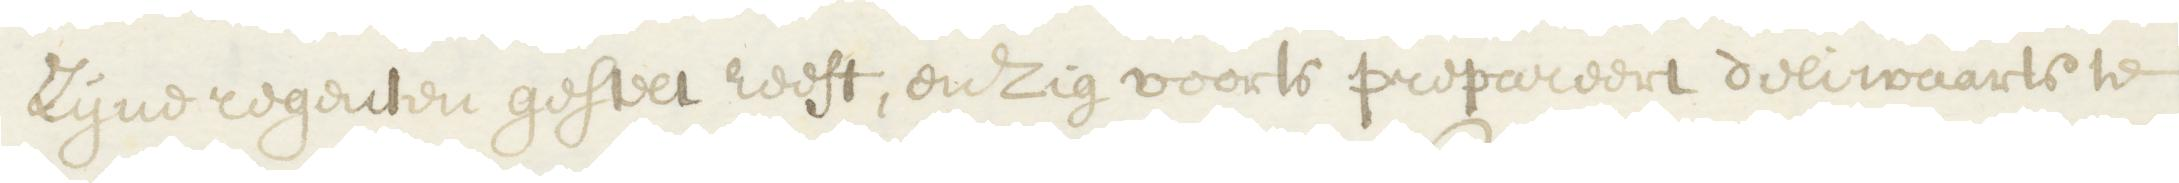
zijne regenten gestelt heeft, en zig voorts prepareert deliwaarts te
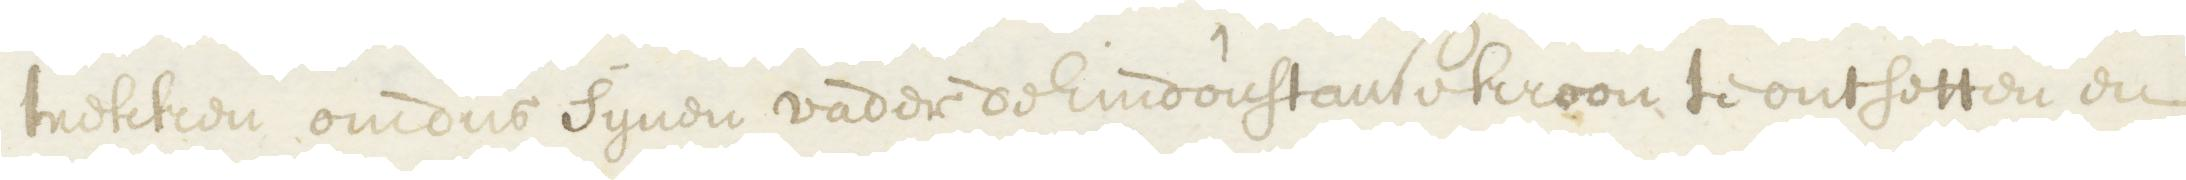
trekken om dus sijnen vader de hindoustanse kroon te ontsetten en
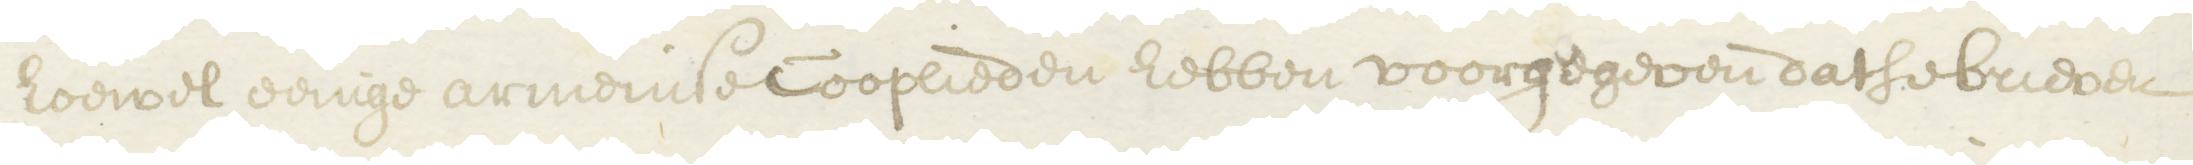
hoewel eenige armenise cooplieden hebben voorgegeven datse brieven
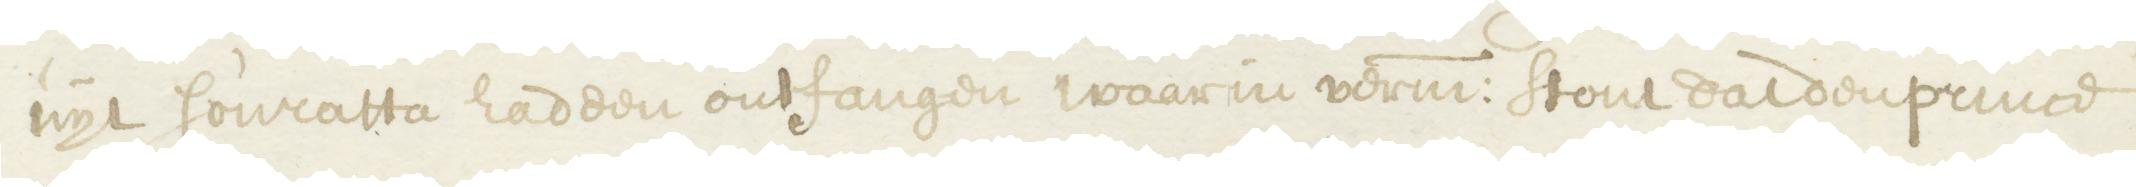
uijt souratta hadden ontfangen waar in verm: stont dat den prince
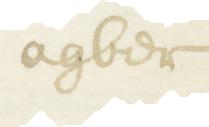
agber
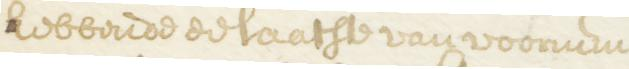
hebbende de laatste van voornem
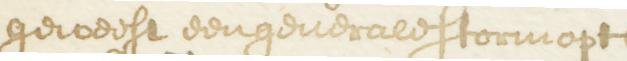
geweest een generale storm opt
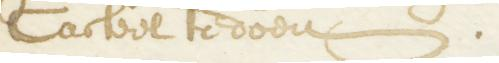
Casteel te doen.
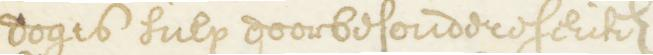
dog is sulx door besondere schik
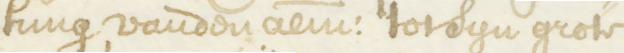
king, van den alm: tot syn grote
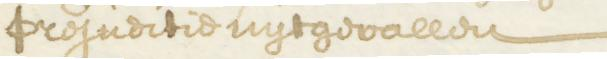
projuditie uijtgevallen
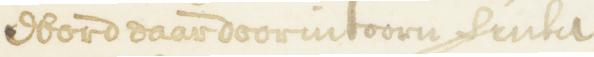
word daar door in toorn verrukt
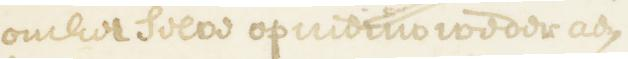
om het selve op nieuw weder aen
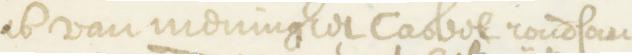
is van mening het Casteel rondsan
